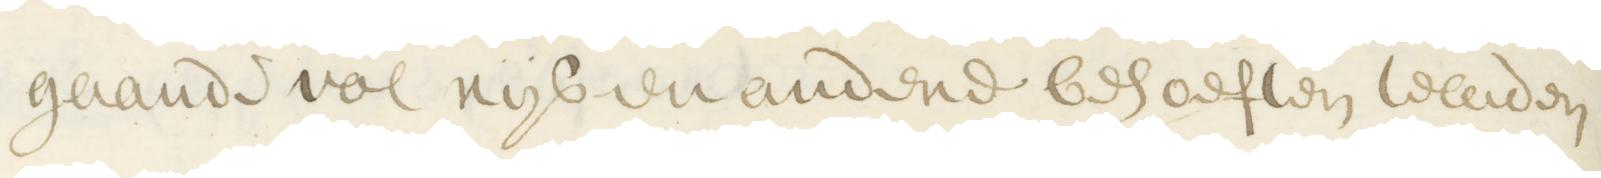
gaande vol rijs en andere behoeften teladen
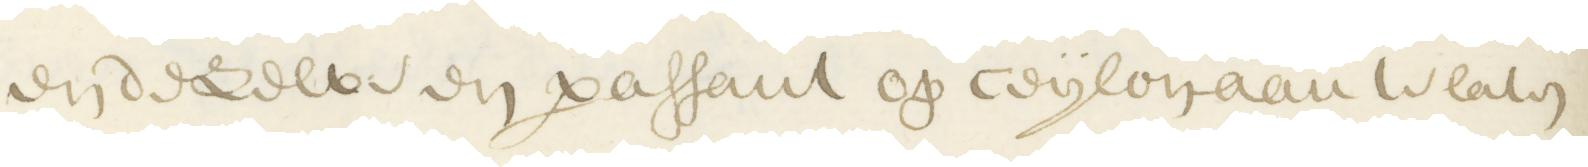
en dezelve en passant op ceijlon aan te laten
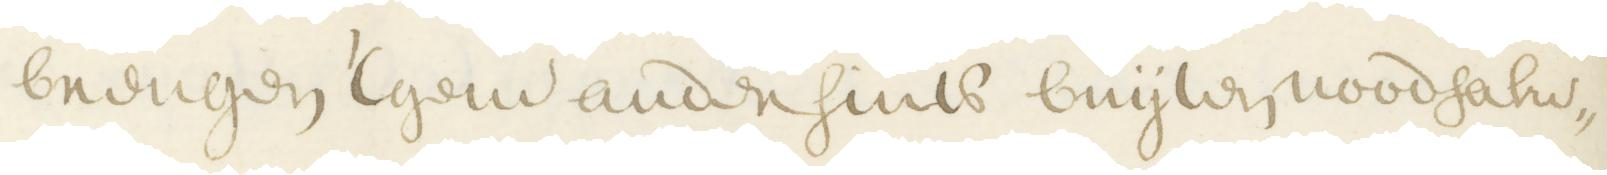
brengen 't gene andersints buijten noodsake„
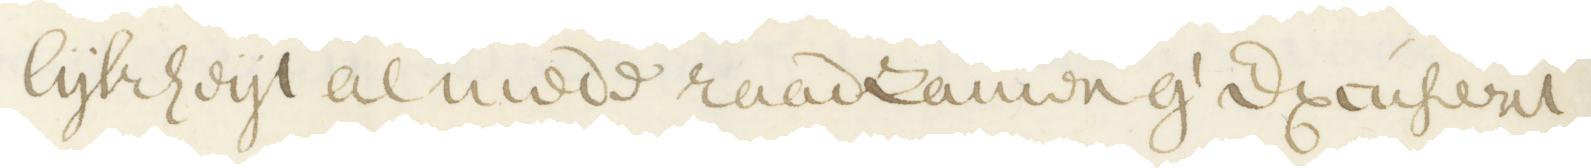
lijkheijt almede raadzamer g’Excuseert
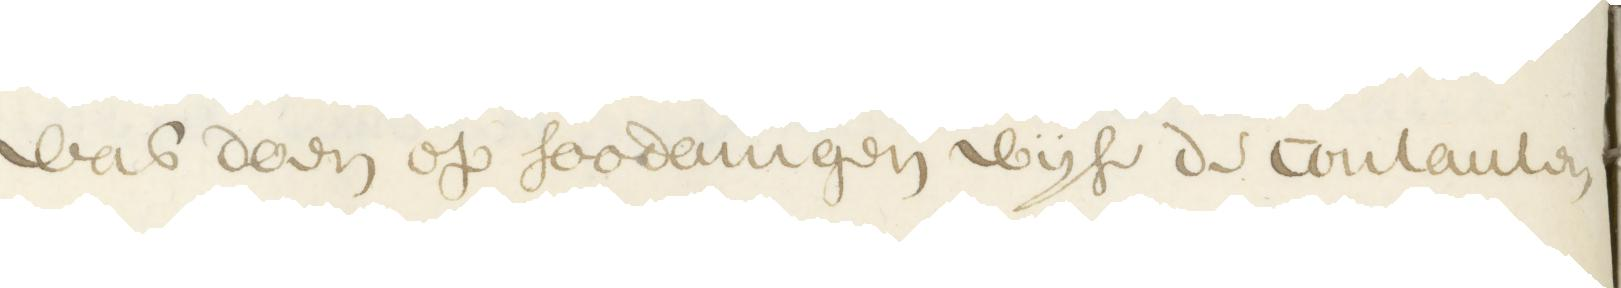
was doen op soodanigen wijs de contanten
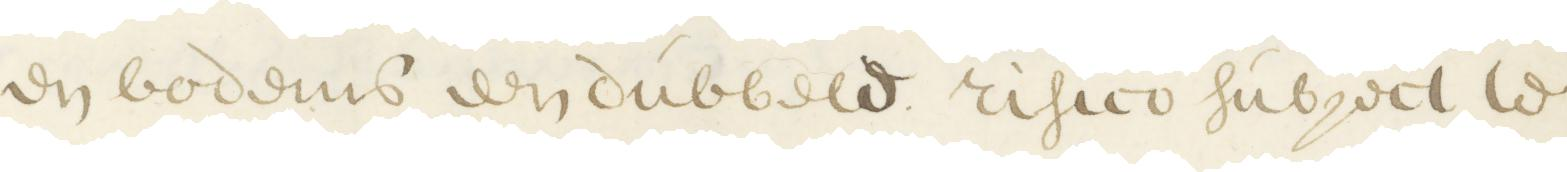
en bodems en dubbele risico subject te
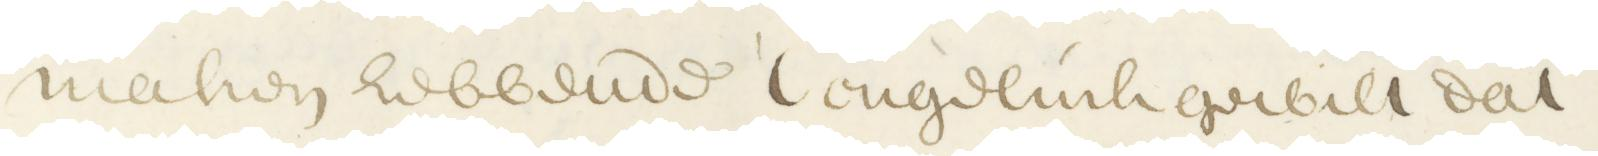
maken hebbende 't ongeluck gewilt dat
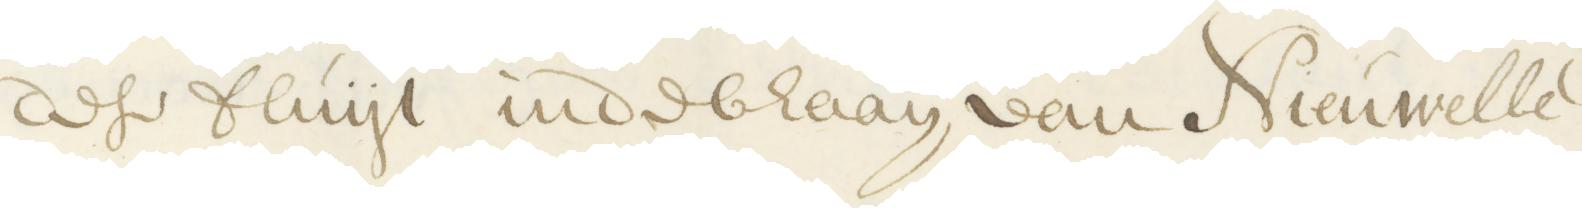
dese fluijt inde bhaaij van Nieuwelle
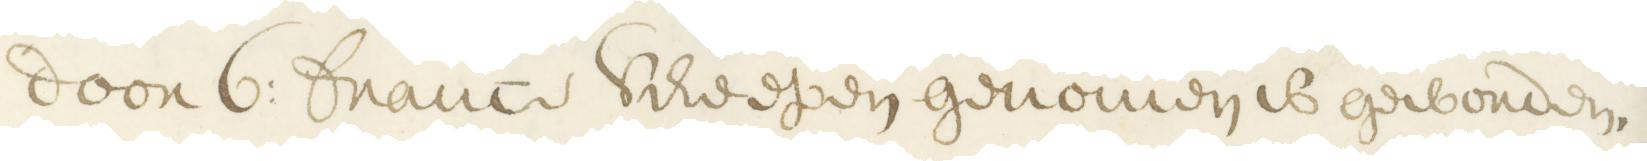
door 6: france scheepen genomen is geworden,
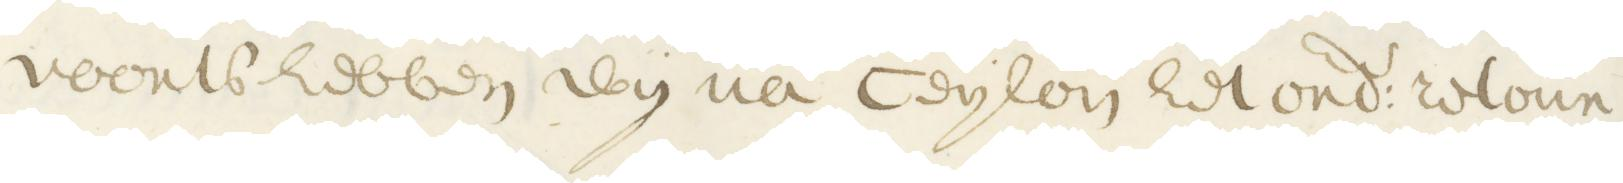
voorts hebben wij na Ceijlon het ord: retour
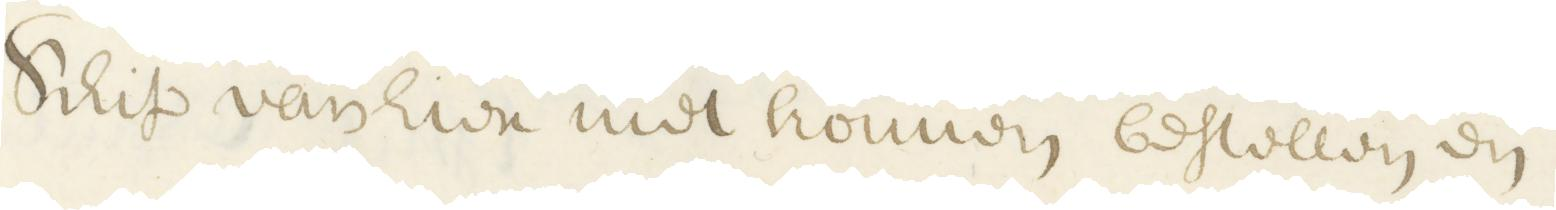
schip van hier niet konnen bestellen en
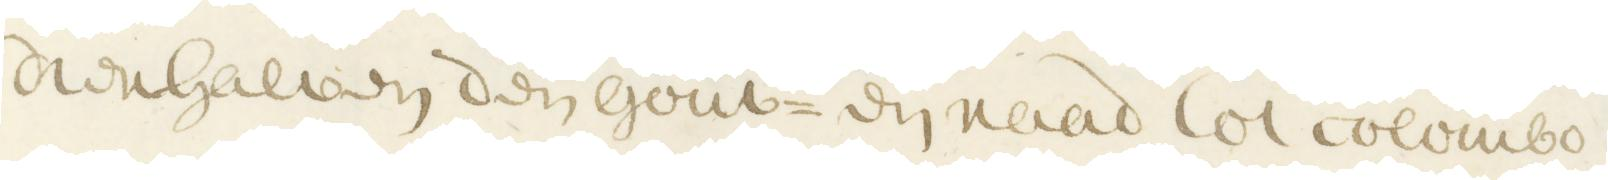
dierhalven den gouv=r en raad tot colombo
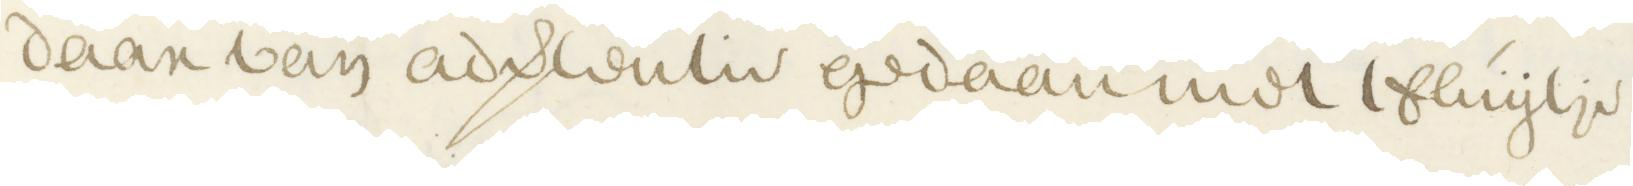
daar van advertentie gedaan met 't fluijtje
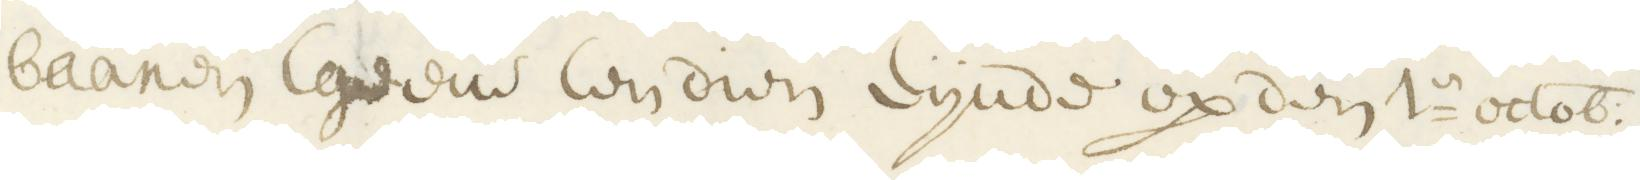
baaren 'tgeene ten dien Eijnde op den 1=en octob:
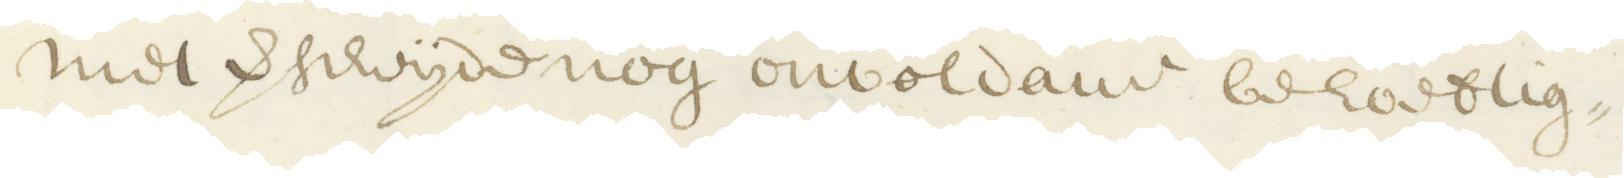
met verscheijde nog onvoldane behoeftig„
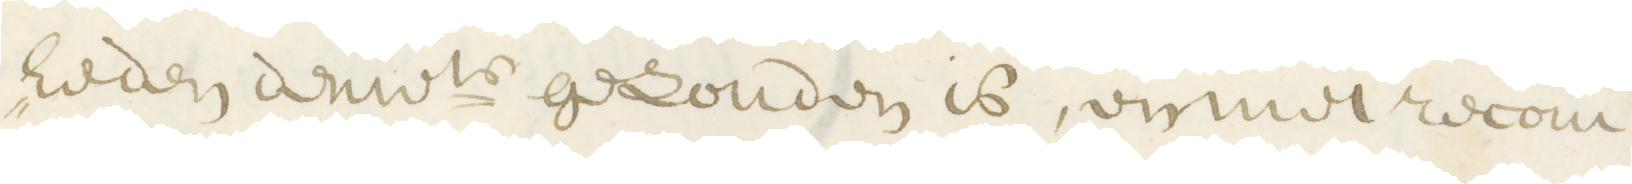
„heden derw=ts gezonden is, en met recom
